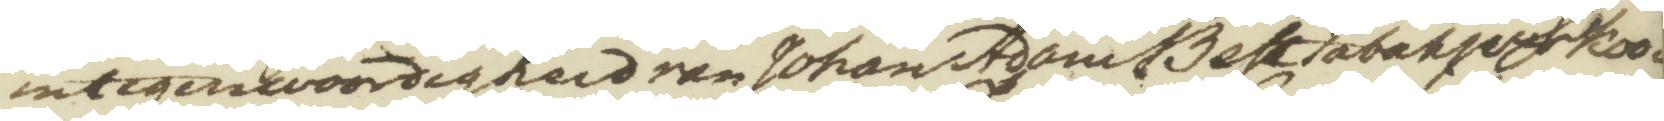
integenwoordigheid van Johan Adam Best Tabakverkoo
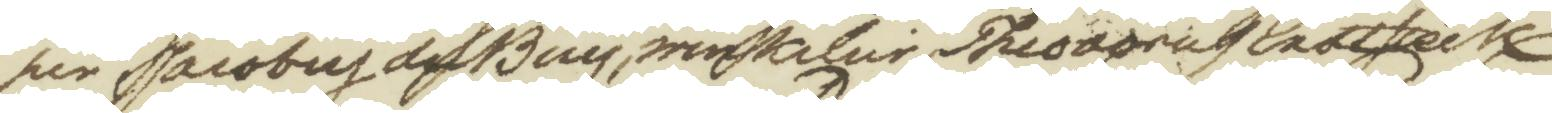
per, Jacobus du Buy, winkelier, Theodorus Erdtsieck
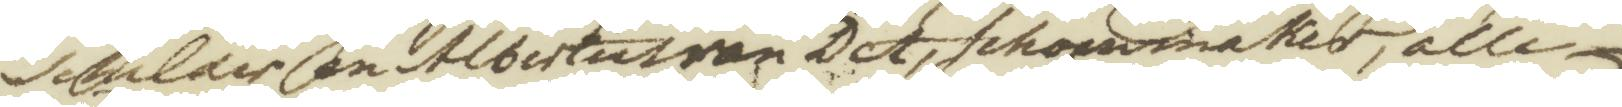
schilder en Albertus van Det, schoenmaker, alle
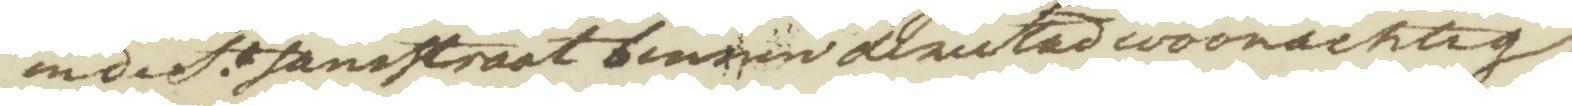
in de S. Jansstraat binnen dezestad woonachtig
